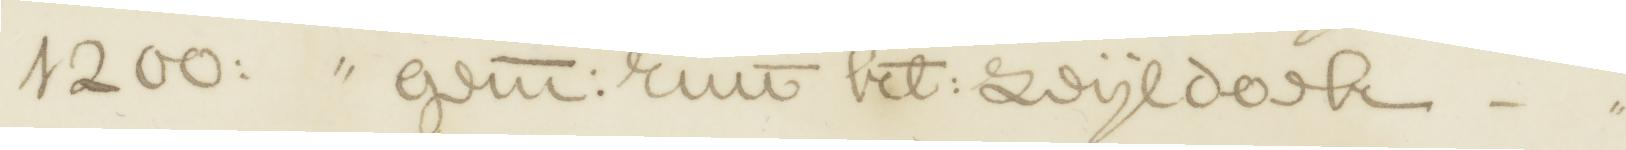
1200: „ gem: ruw kl: zeijldoek - „
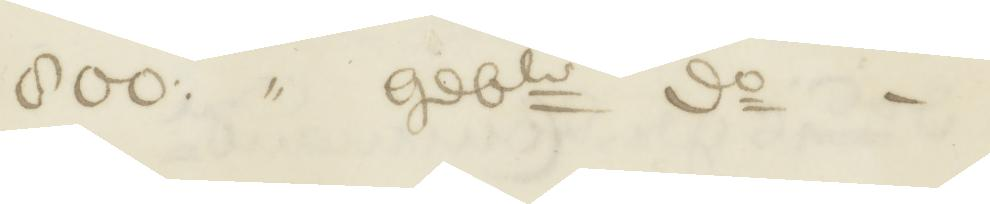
800: „ geb=te d=o -
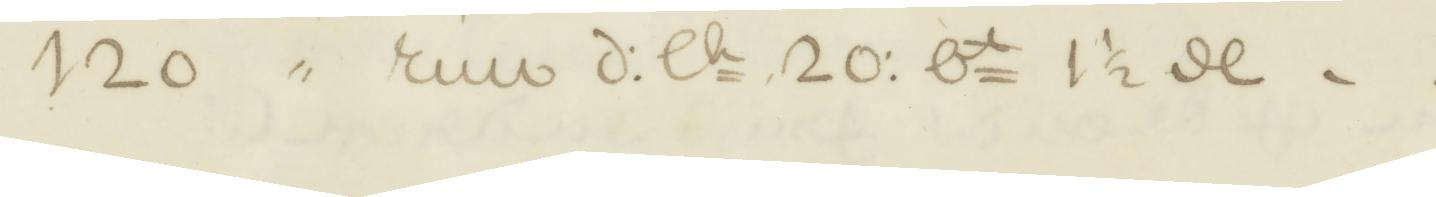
120 „ ruw d: l=k, 20: b=t 1½ el -
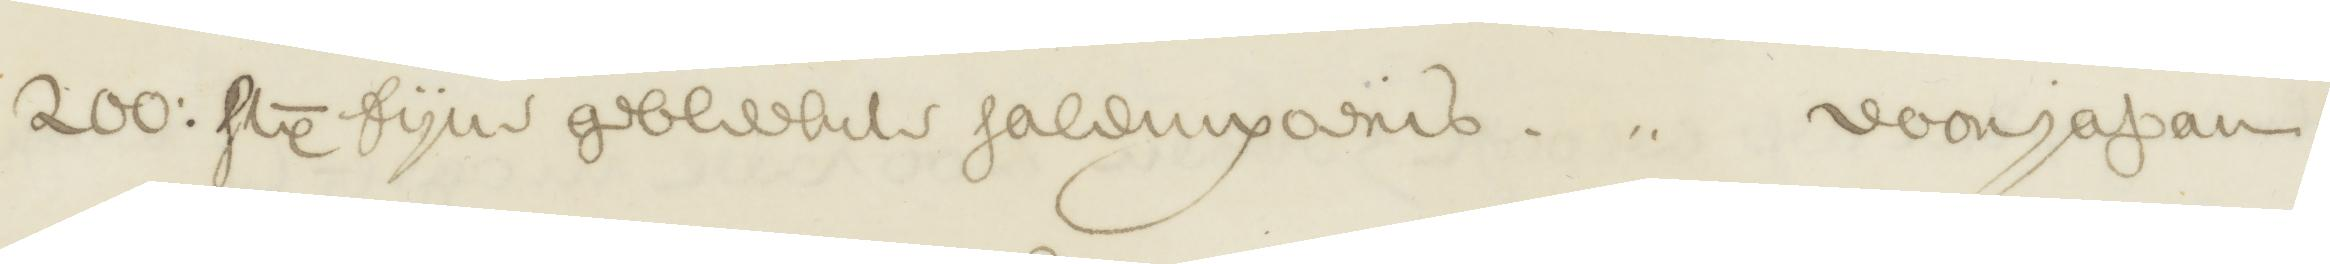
200: stx fijne gebleekte salempoeris - „ voorjapan
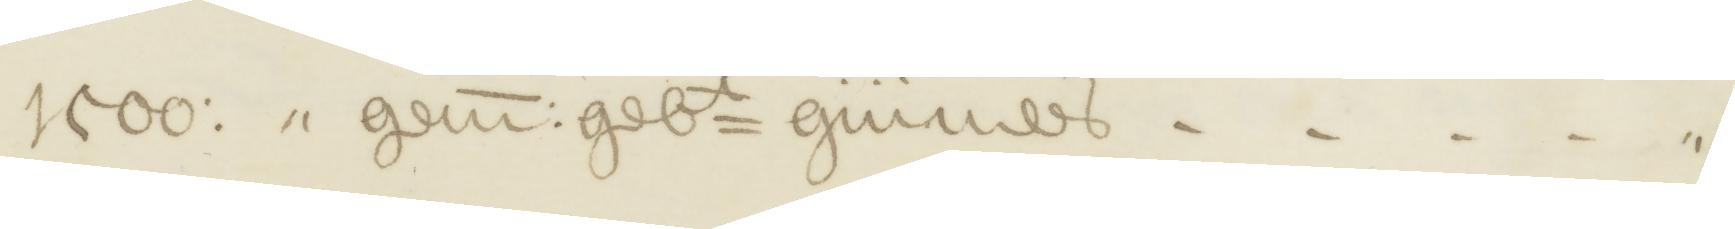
1500: „ gem: geb=t guinees - - - - „
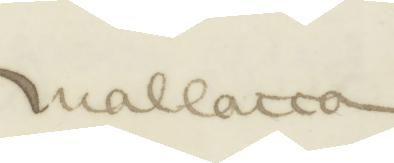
mallacca
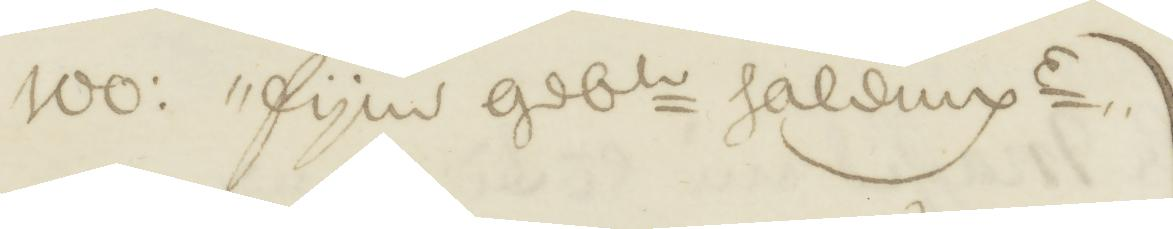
100: „fijne geb=te salemp=s,,
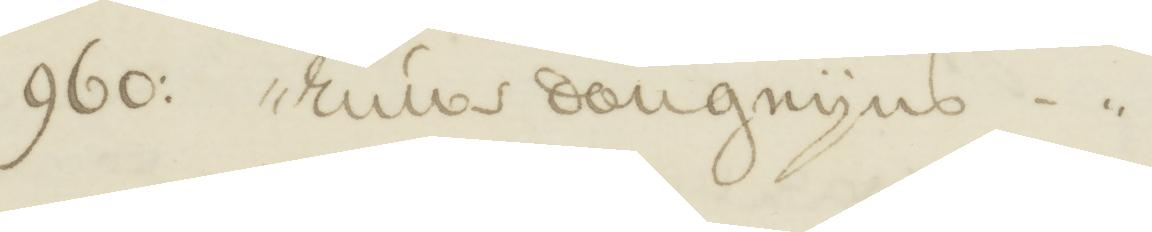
960: „ruwe dongrijns - „
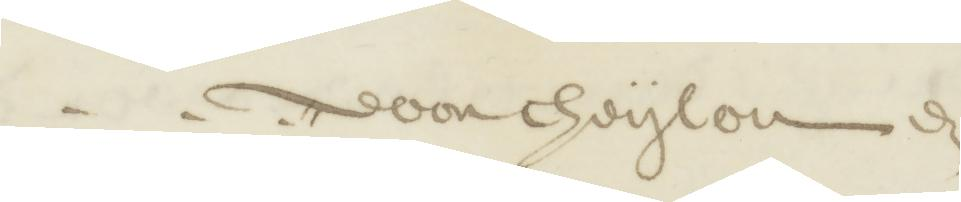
- - „ voor cheijlon en
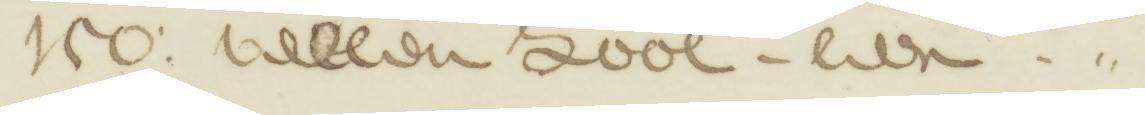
150: vellen zool -leer - „
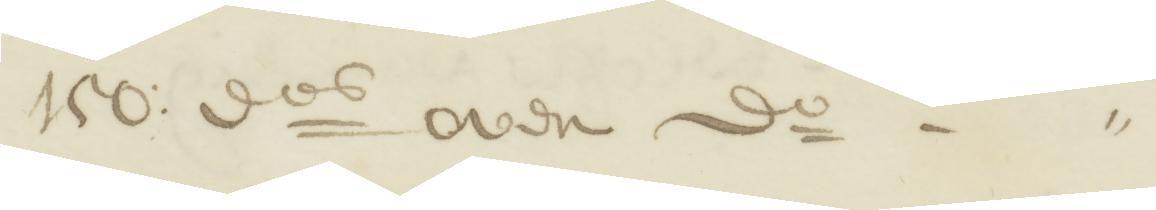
150: d=os over d=o - „
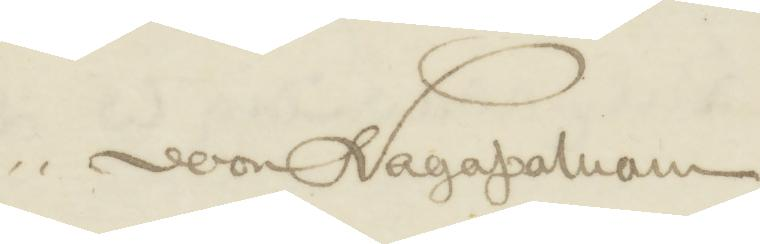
„ voor Nagapatnam
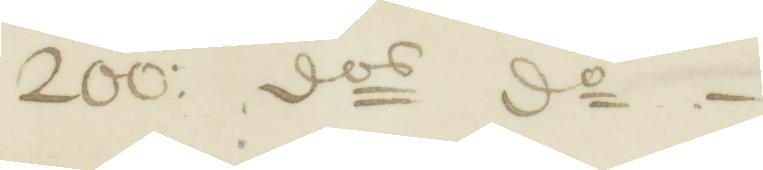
200: d=os d=o -
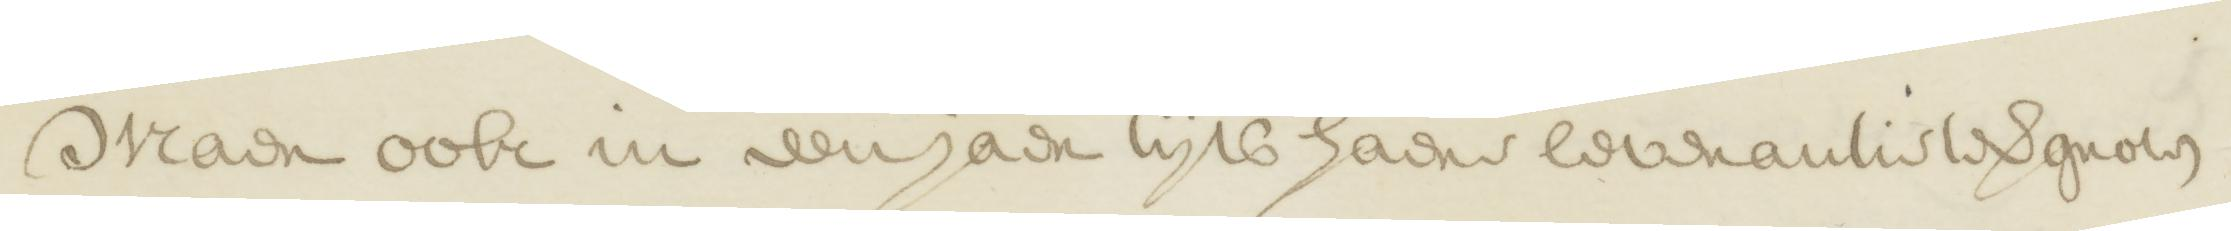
Maer ook in een jaer tijts haere leverantie te vergroten
